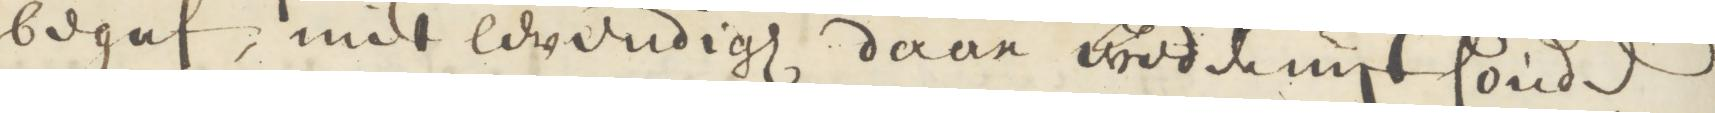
begaf, niet levendigh daar weder uijt soude
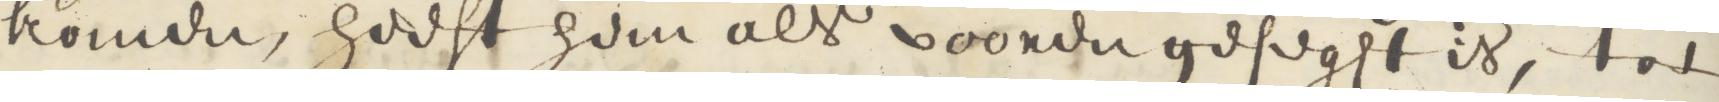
komen, heeft hem alst vooren geseght is, tot
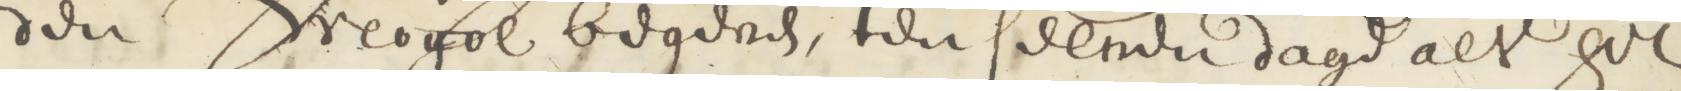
den Mogol begeven, ten selven dage als het
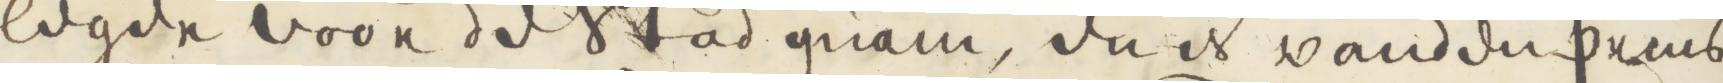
leger voor de stad quam, en is van den prins
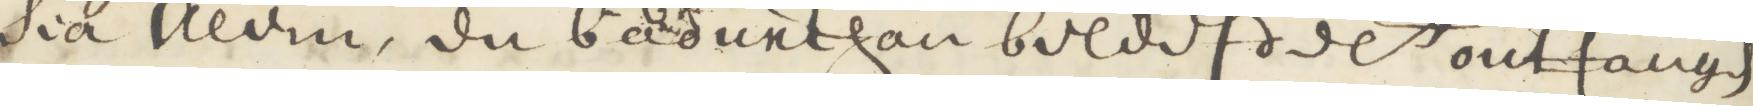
Sia Alem, en badurchan beleefdelt ontfangen
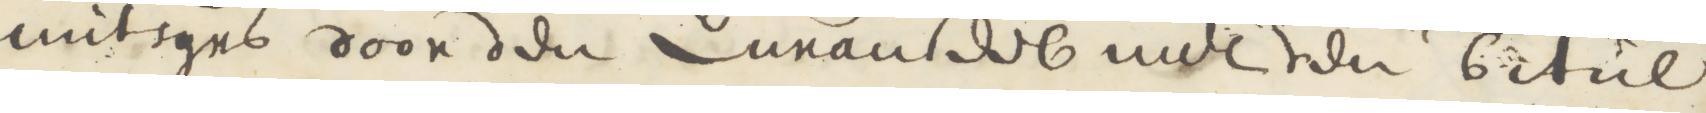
mitsgrs door den Enranseel melden Titul
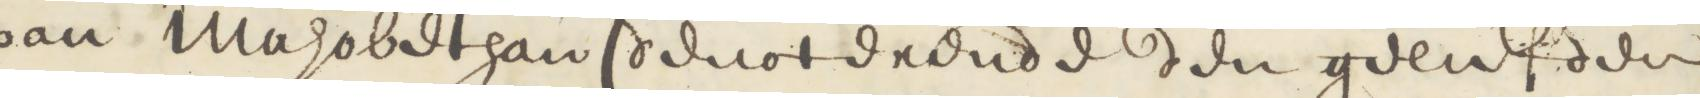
van Mahobethan (denoterende den geen of den
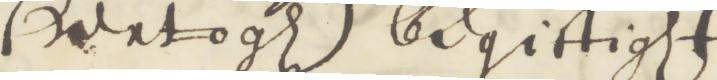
hertogh) begiftight.
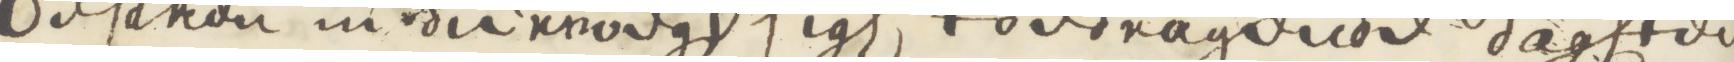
De saken in die rnoegh sigh toedragende daghten
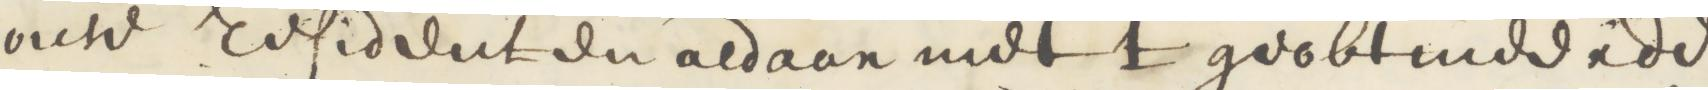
onse resident en aldaar met 't geobtineerde
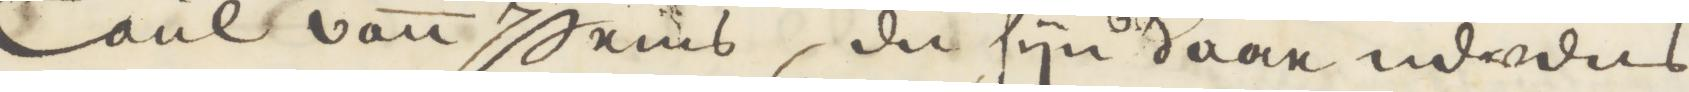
Caul van Prins, en sijn daar nevens
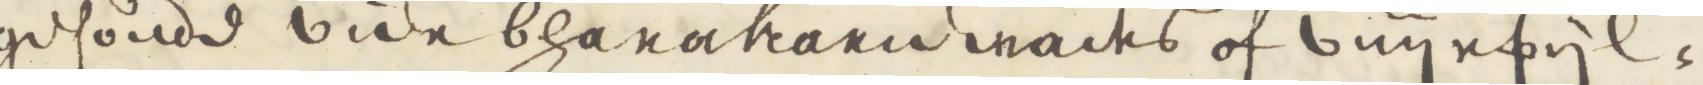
gesonde vier bharakarie wacks of vuijrpijl„
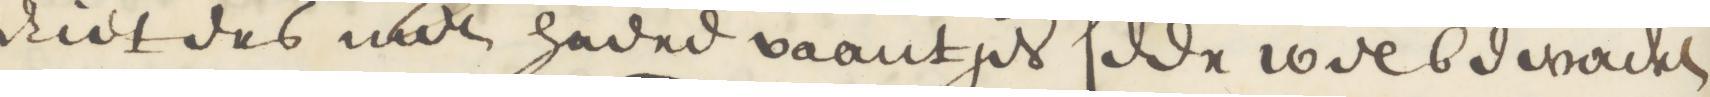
schietens met haere vaantjes seer welbewacke
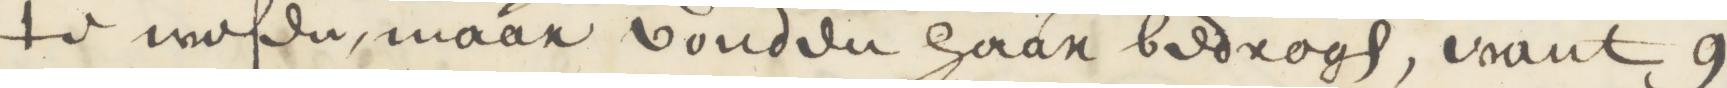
te wesen, maar vonden haar bedrogh, want 9
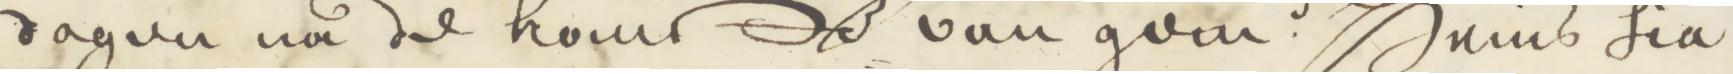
dagen na de komste van gem.e Prinst Sia
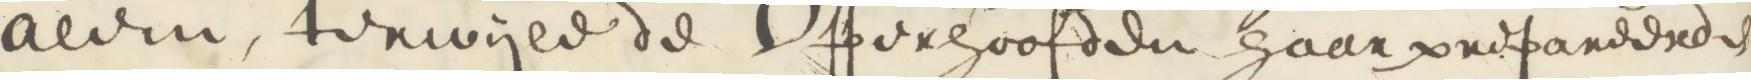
Alem, terwijle de Opperhoofden haar prepareerden
